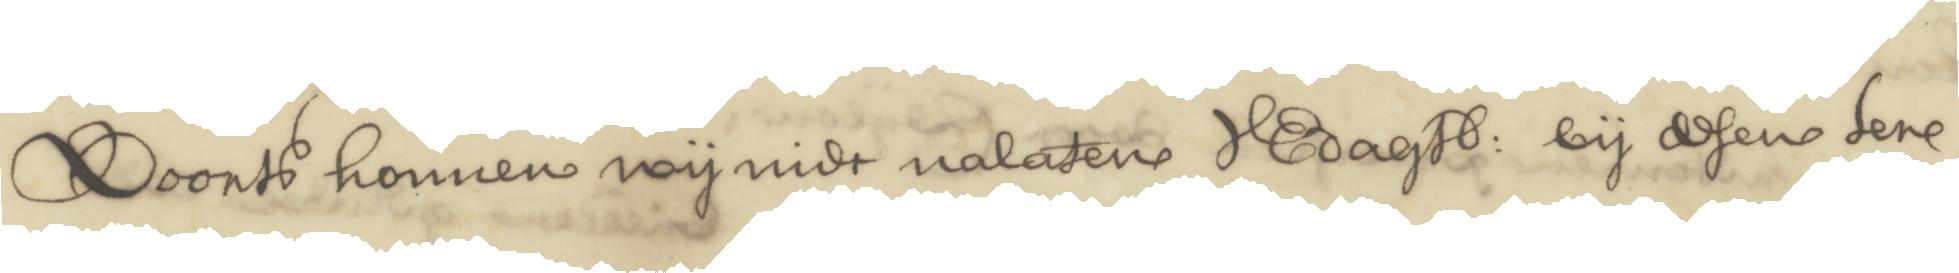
Voorts konnen wij niet nalaten VEdagtb: bij desen ter
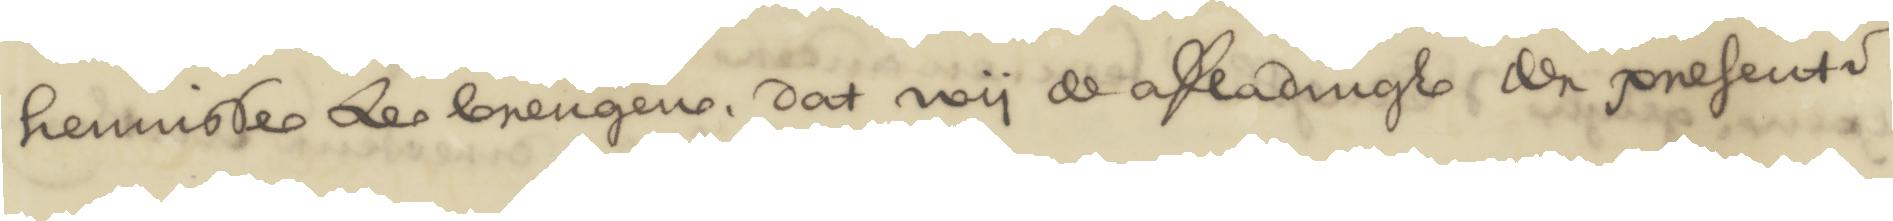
kennisse te brengen, dat wij de afladingh der presente
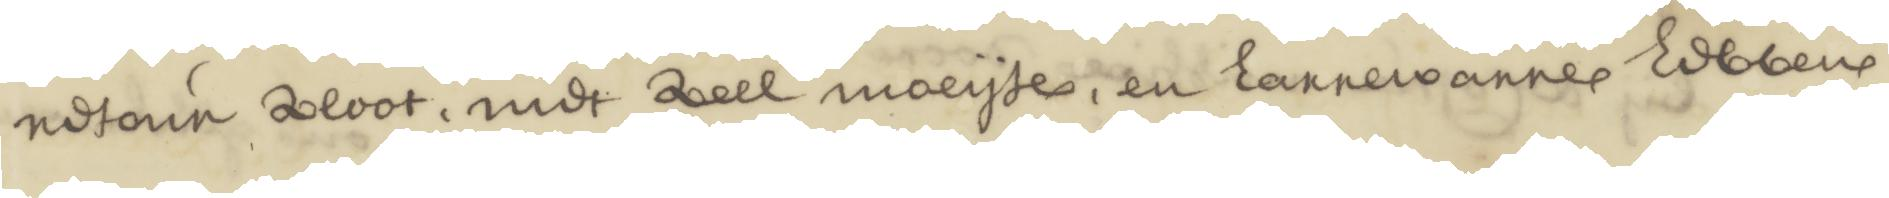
retour vloot, met veel moeijte, en harrewarre hebben
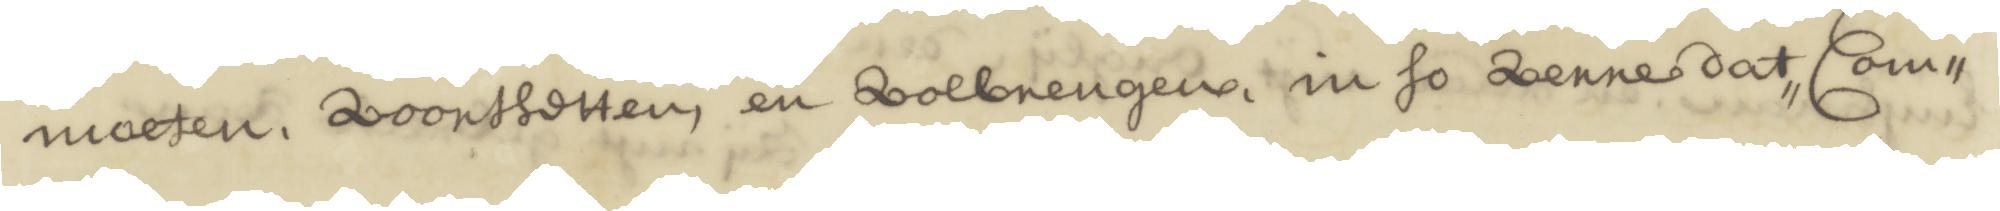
moeten, voortsetten, en volbrengen, in so verre dat„ Com„
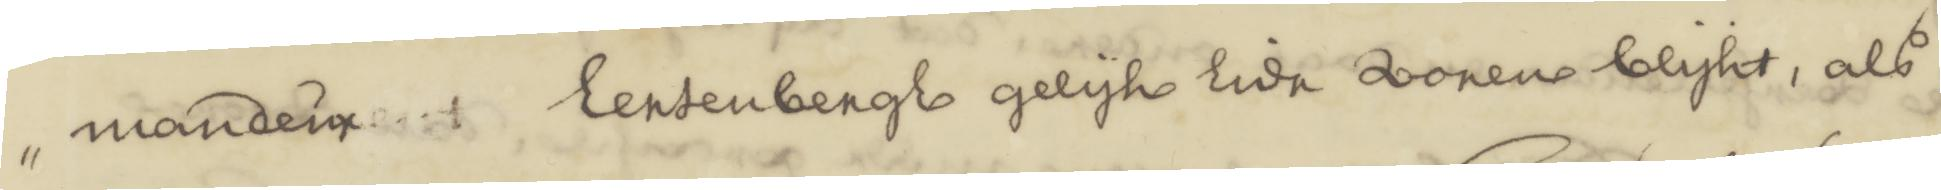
„mandeur hertenbergh gelijk hier voren blijkt, als
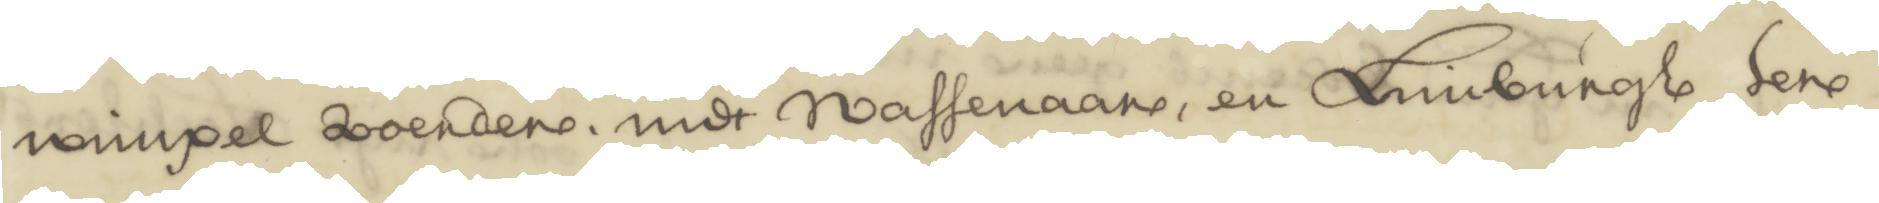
wimpel voerder, met wassenaar, en Limburgh ter
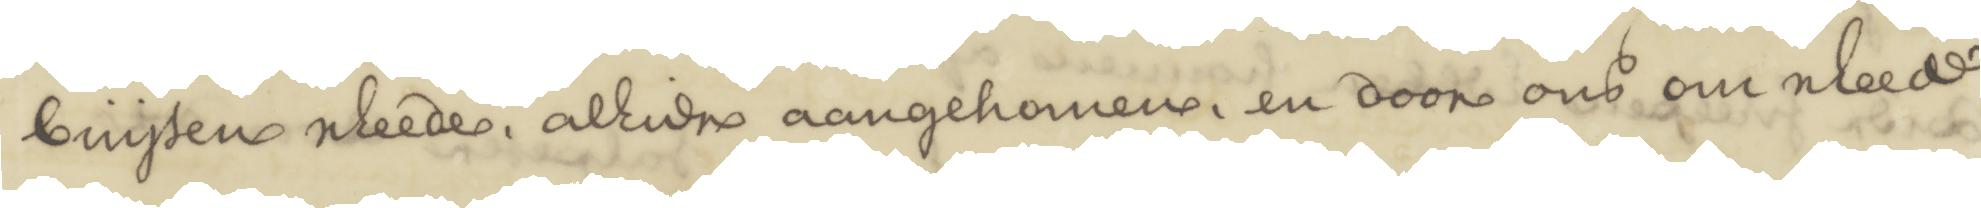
buijten rheede, alhier aangekomen, en door ons om rheede
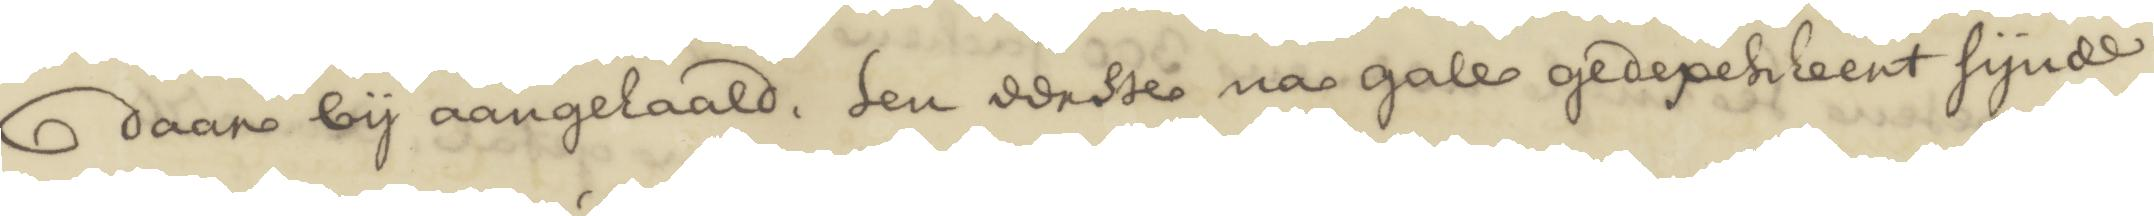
daar bij aangehaald, ten eerste na gale gedepescheert sijnde
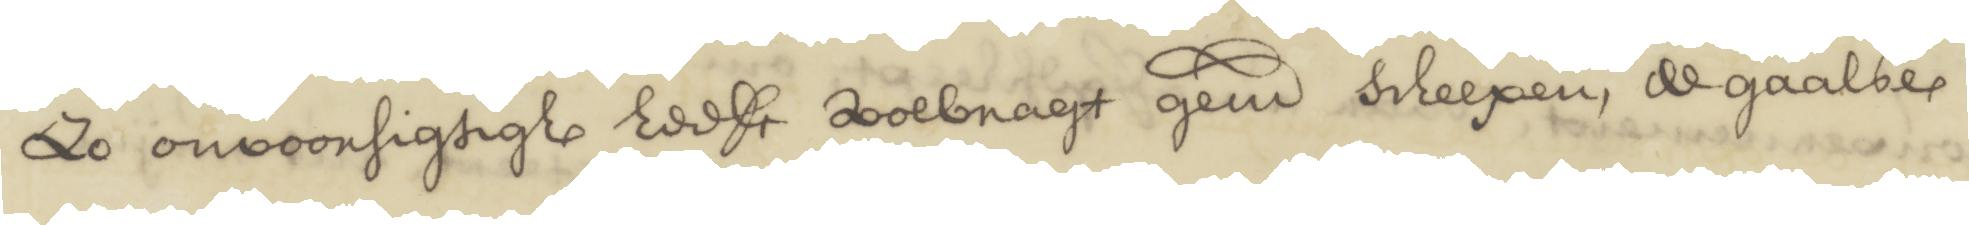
zo onvoorsigtigh heeft volbragt gem scheepen, de gaalse
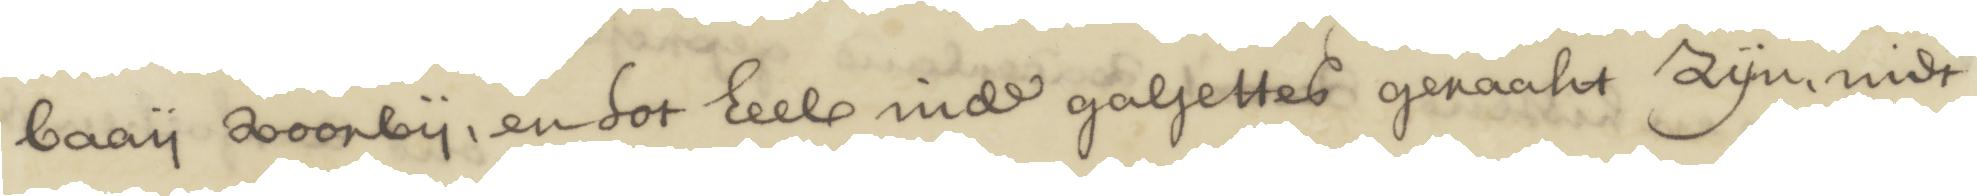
baaij voorbij, en tot heel inde galjettes geraakt zijn, niet
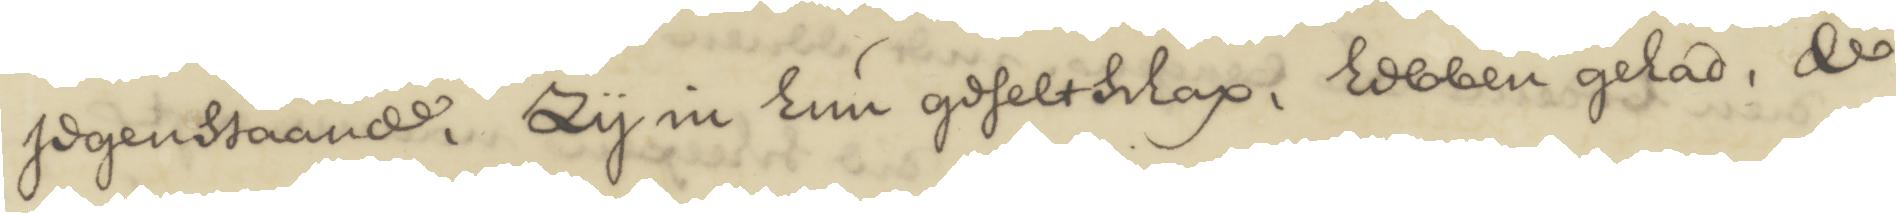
jegenstaande, zij in hun geseltschap, hebben gehad, de
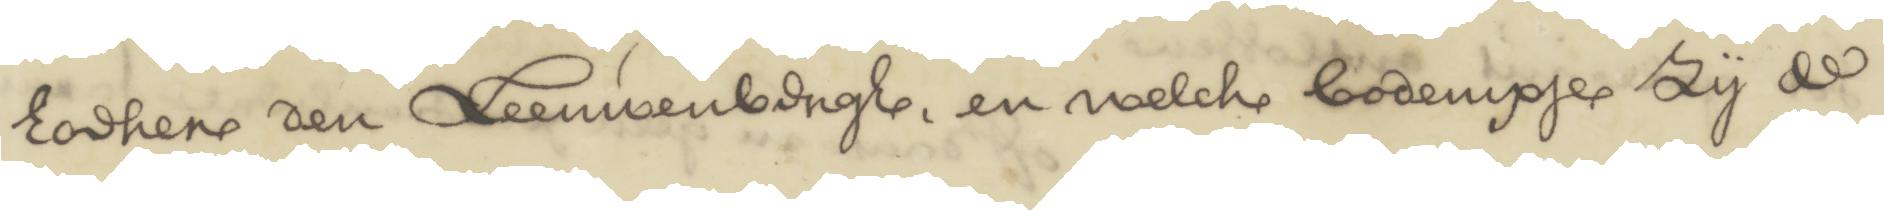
hoeker den Leeuwenbergh, en welck bodempje zij de
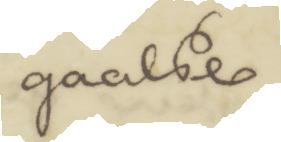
gaalse
